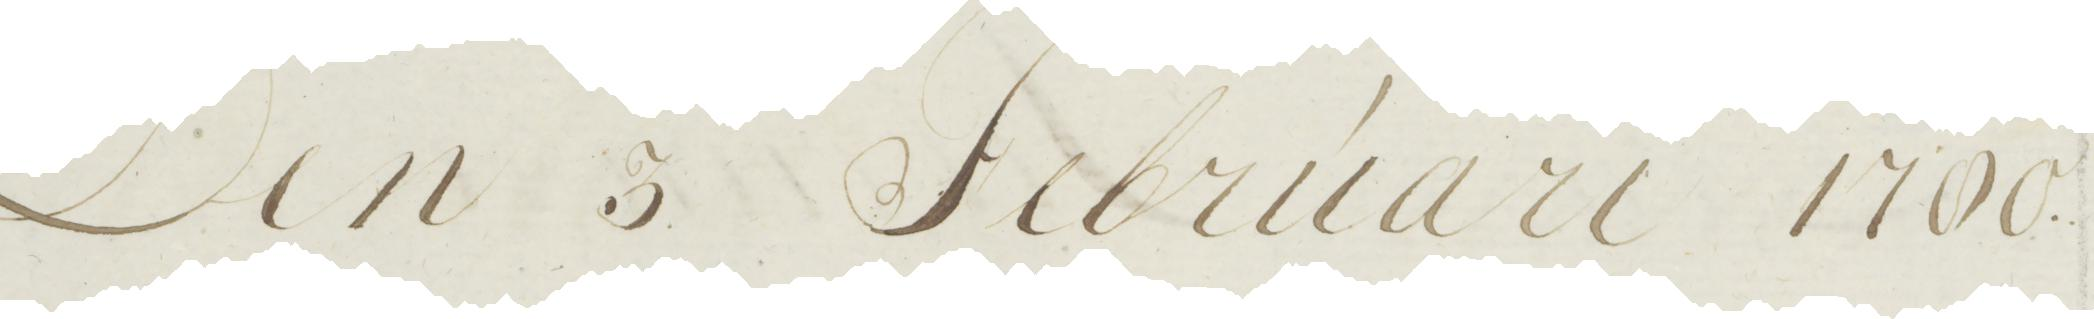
Den 3. Februari 1780.
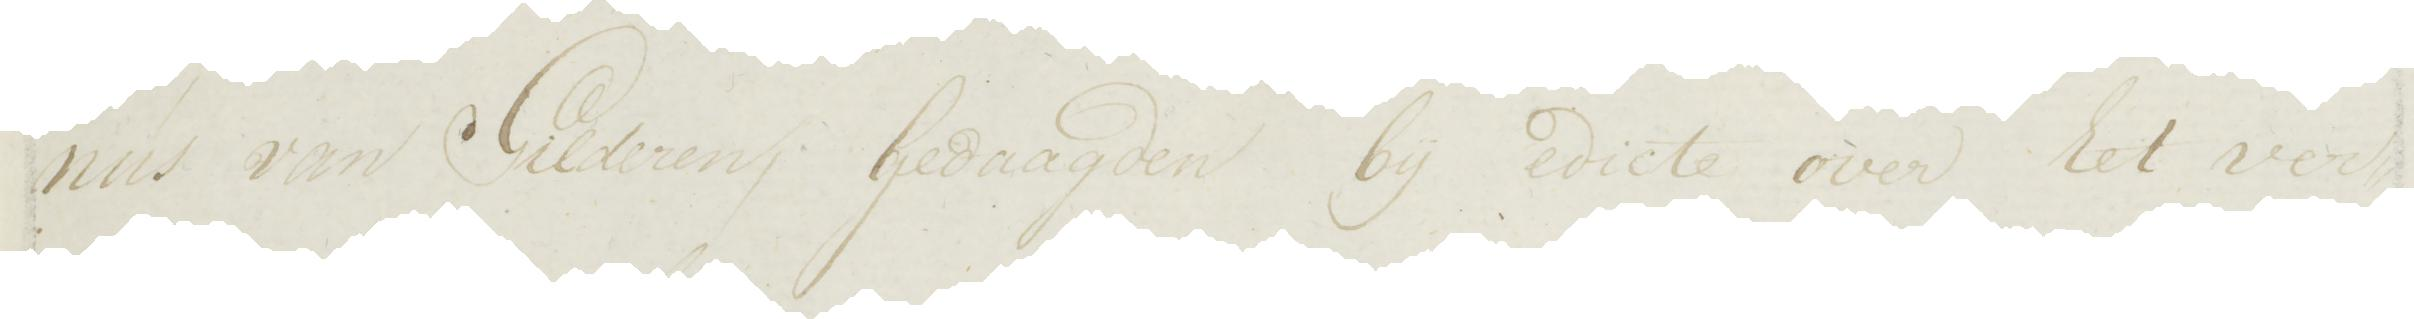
nus van Gilderen, Gedaagden bij edicte over het ver„
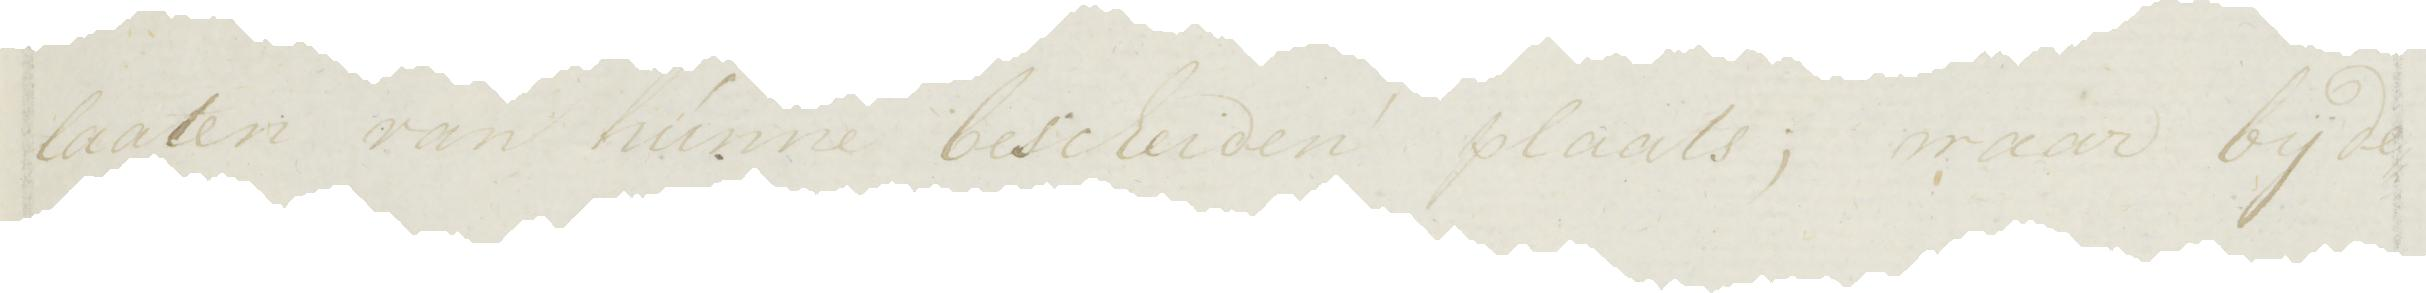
laaten van hunne bescheiden plaats; maar bij de„
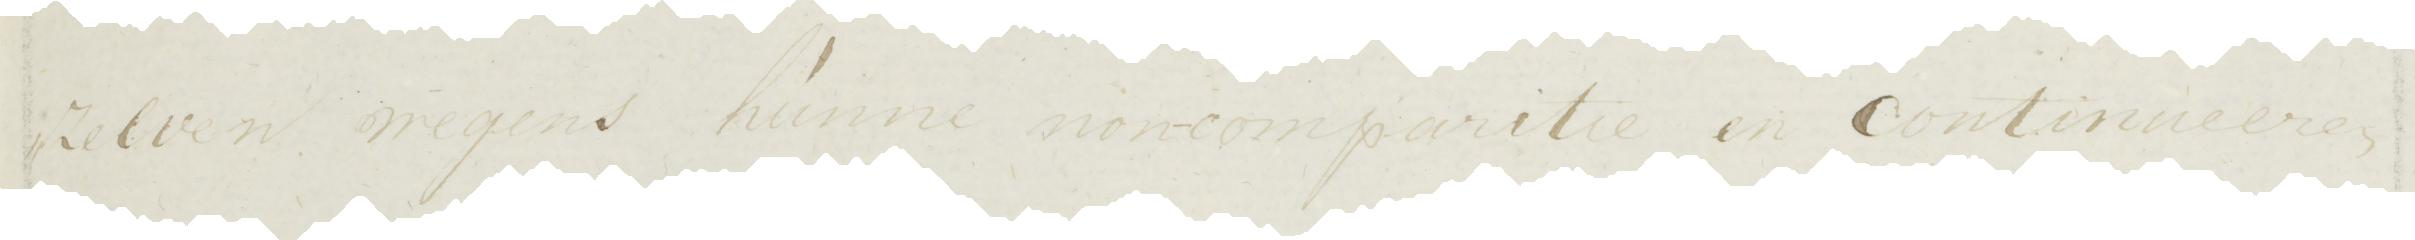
„zelven wegens hunne non-comparitie en continueeren
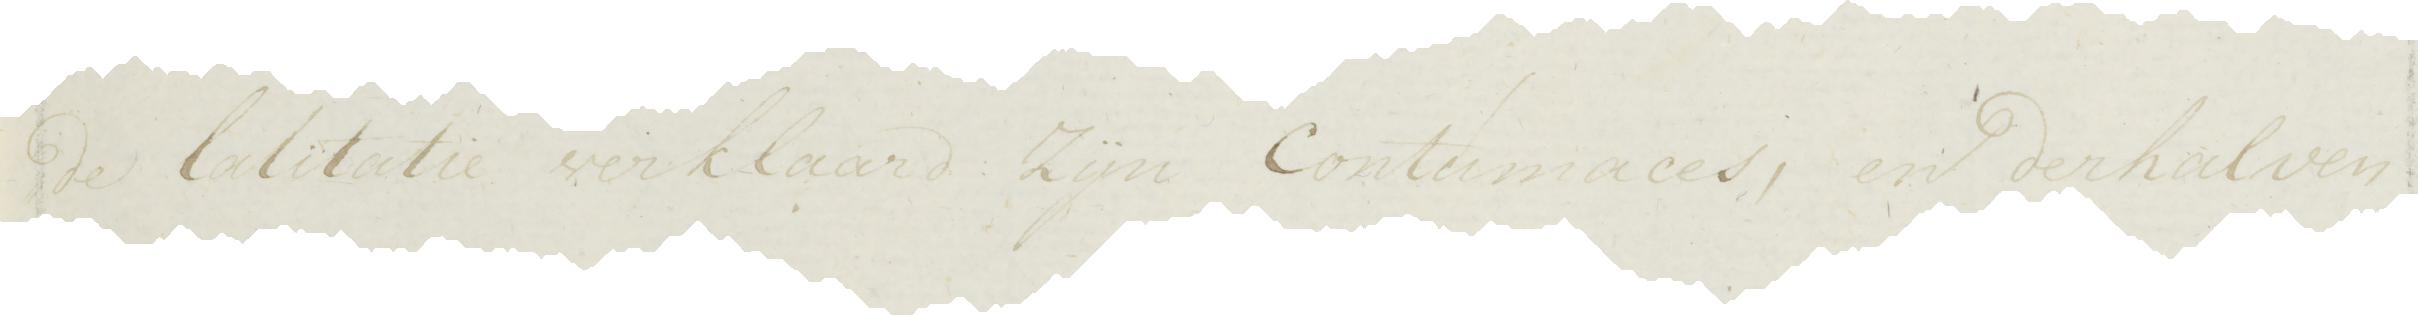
de lalitatie verklaard zijn contumaces, en derhalven
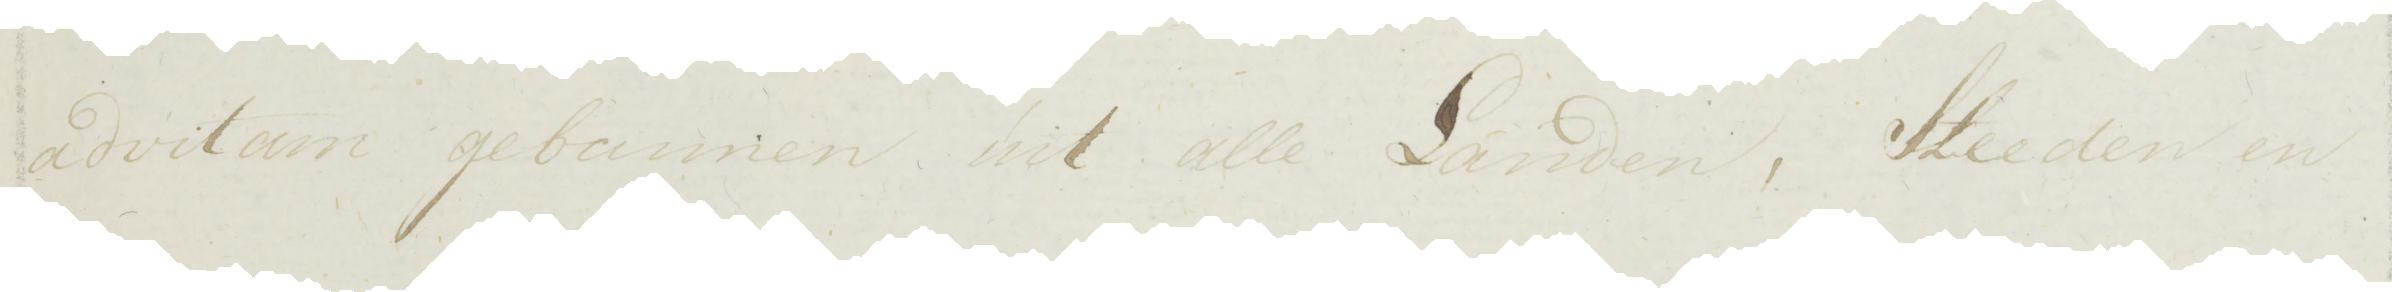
advitam gebannen uit alle Landen, Steeden en
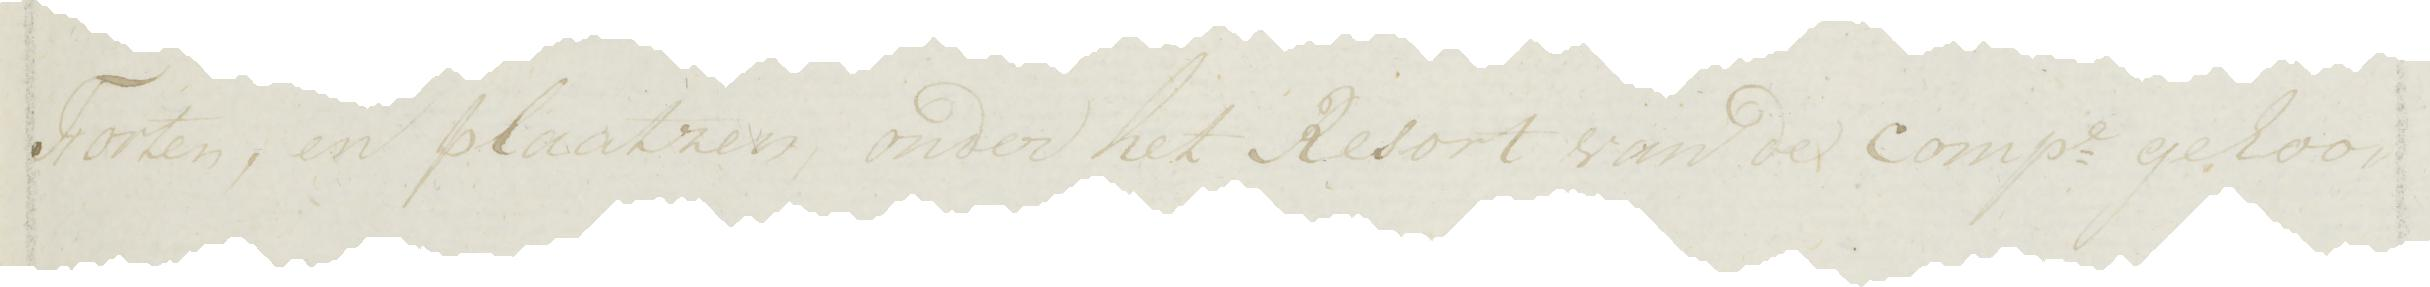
Forten, en plaatzen, onder het Resort van des Comp=s gehoo
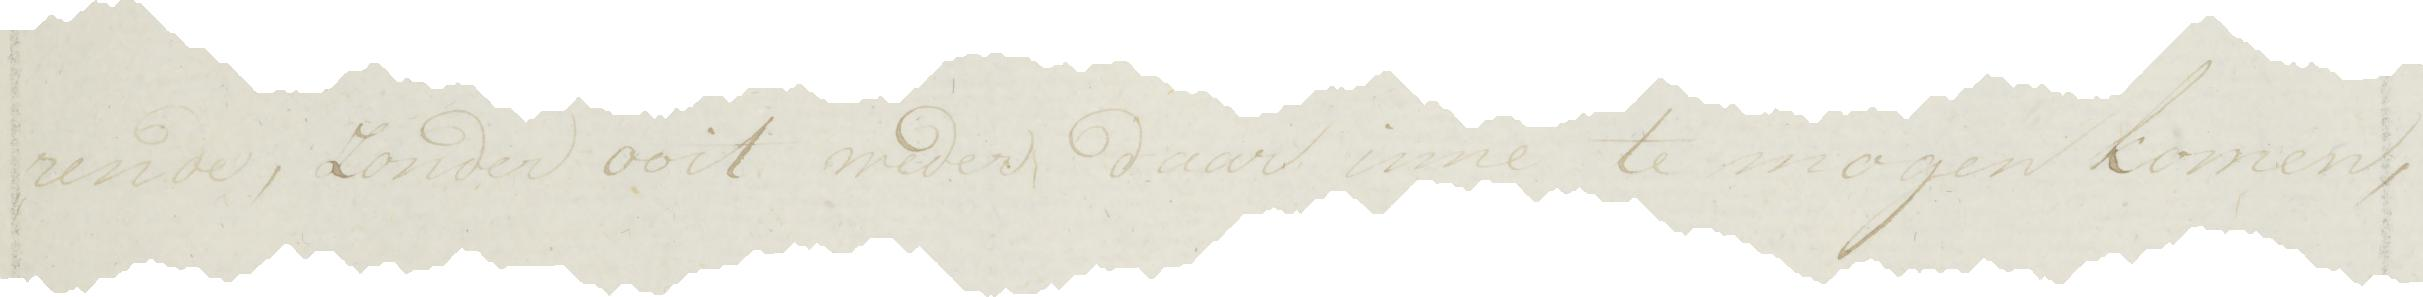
„rende, zonder ooit weder daar inne te mogen komen,
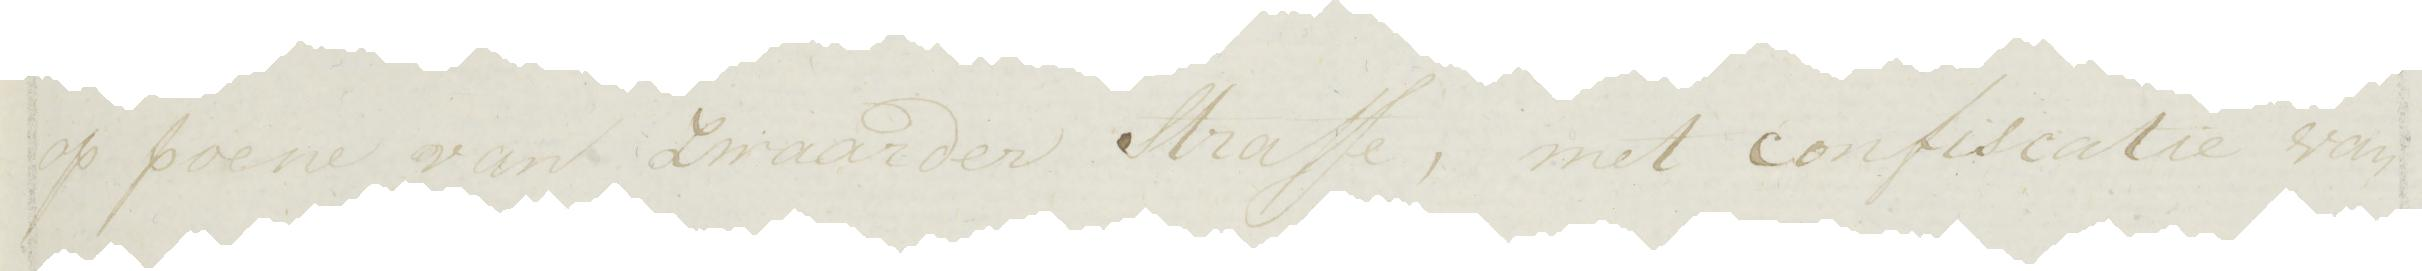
op poene van zwaarden straffe, met confiscatie van
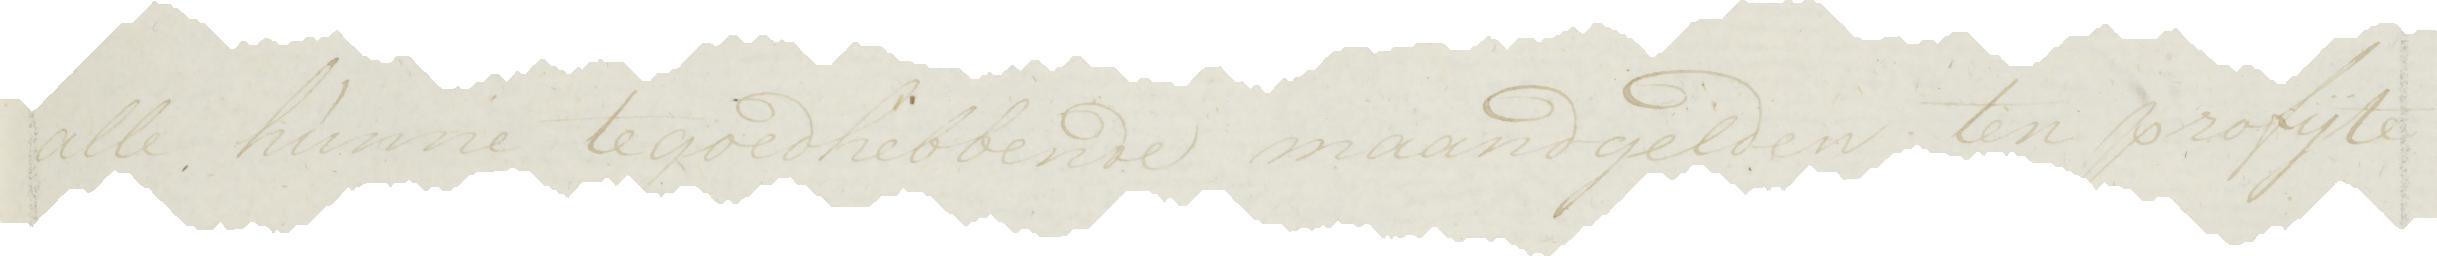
alle hunne tegoedhebbende maandgelden ten profijte
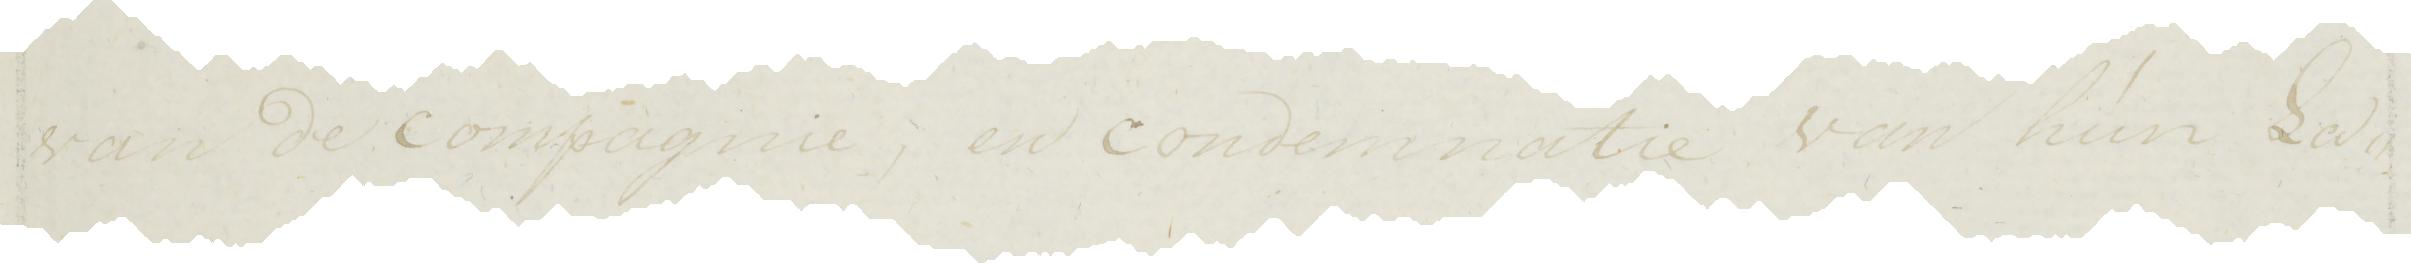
van de compagnie; en condemnatie van hun La
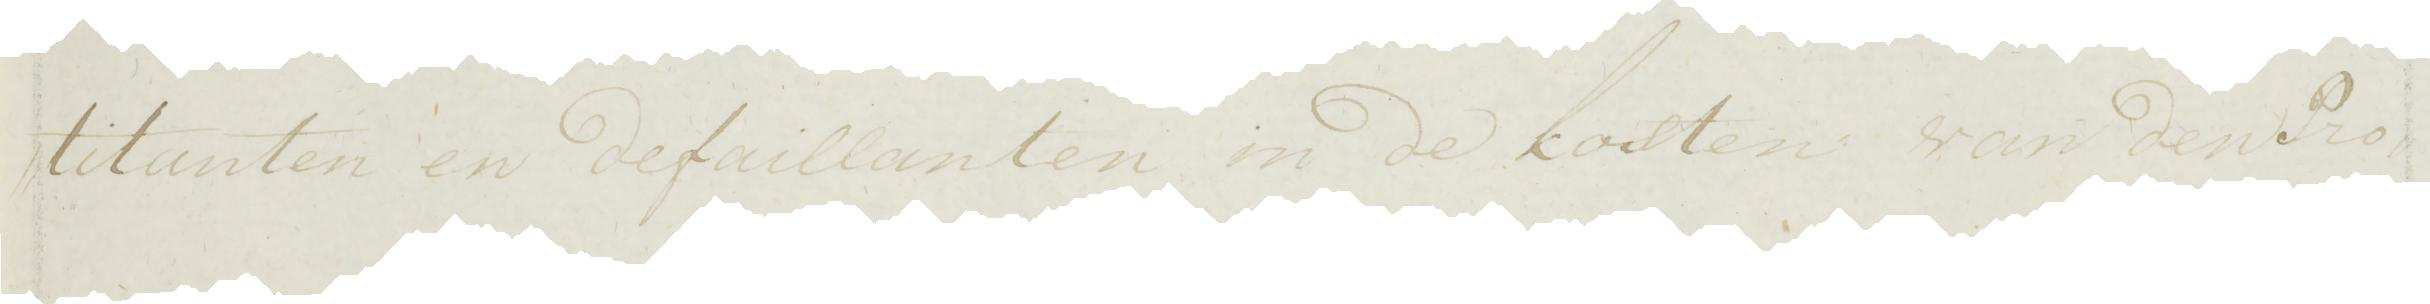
„titanten en defaillanten in de kasten van den Pro
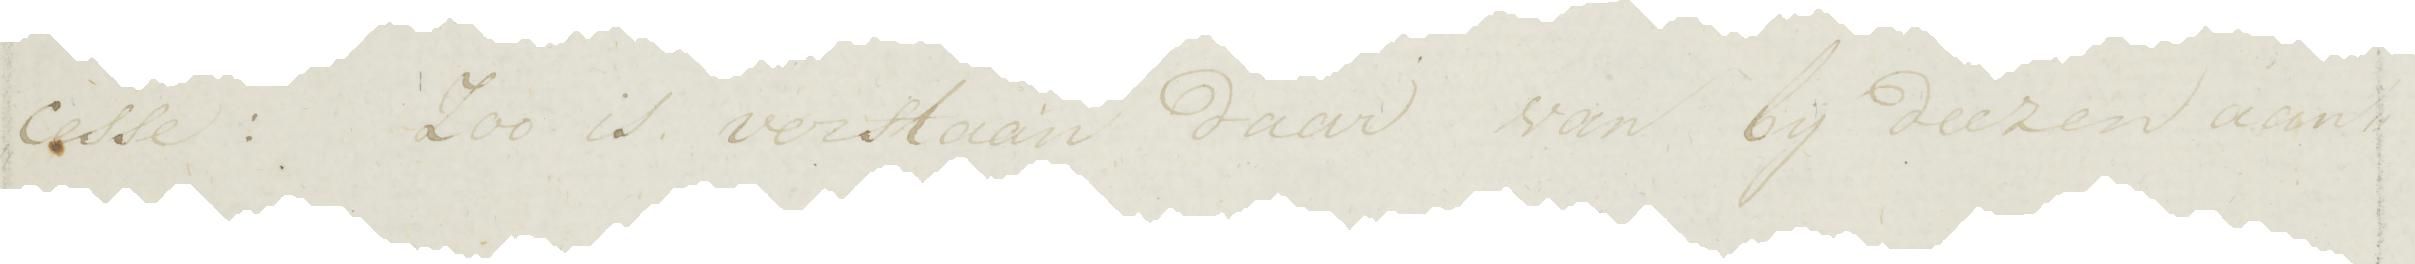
„cesse: Zoo is verstaan daar van bij deezen aan
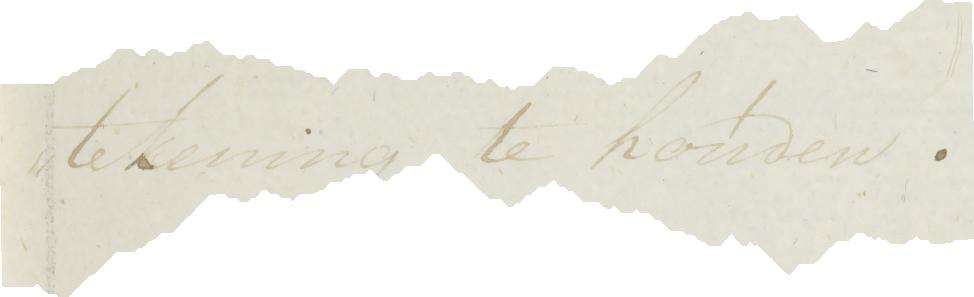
„tekening te houden.
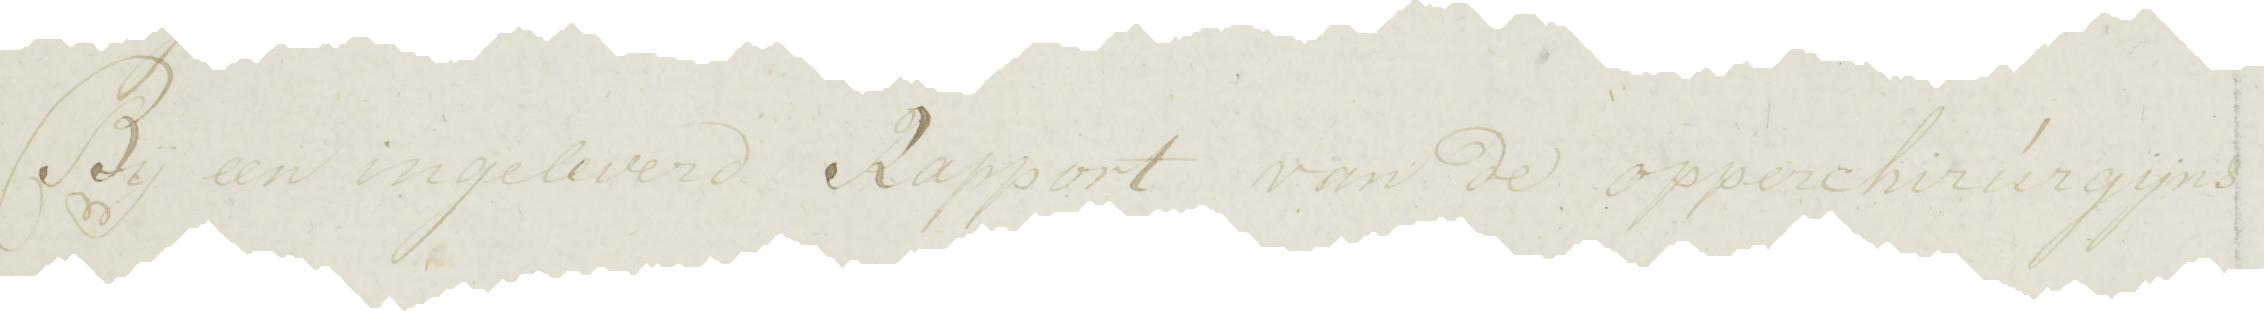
Bij een ingeleverd Rapport van de opperchirurgijns
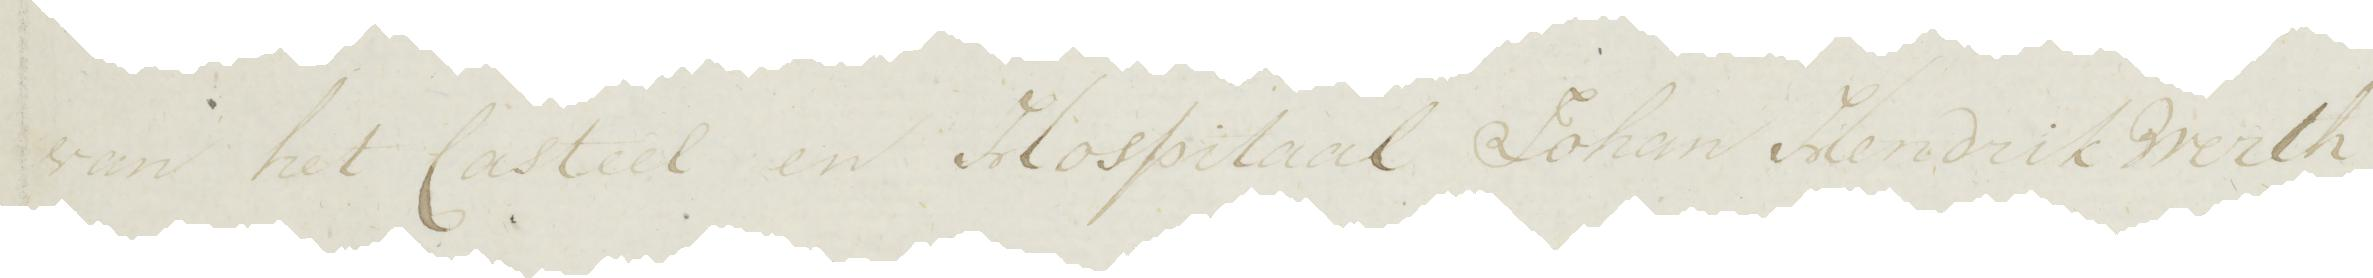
van het Casteel en Hospitaal Johan Hendrik Werth
